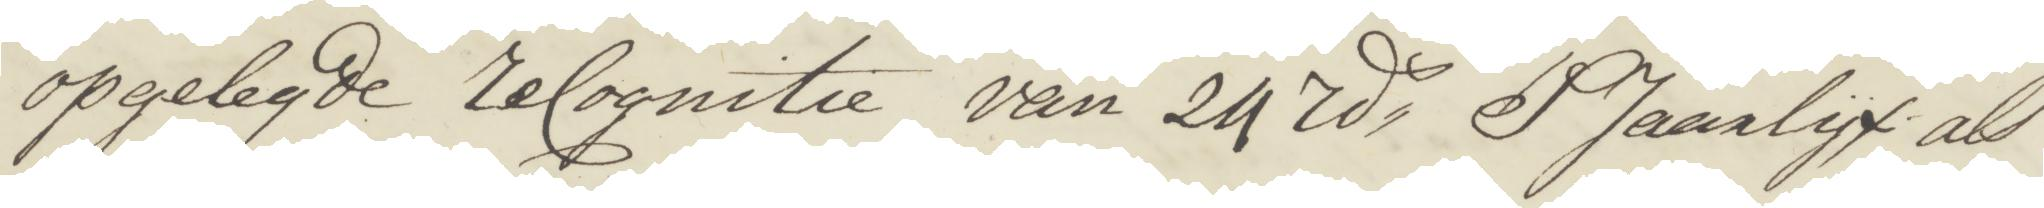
opgelegde recognitie van 24 rd„s 's Jaarlijx als
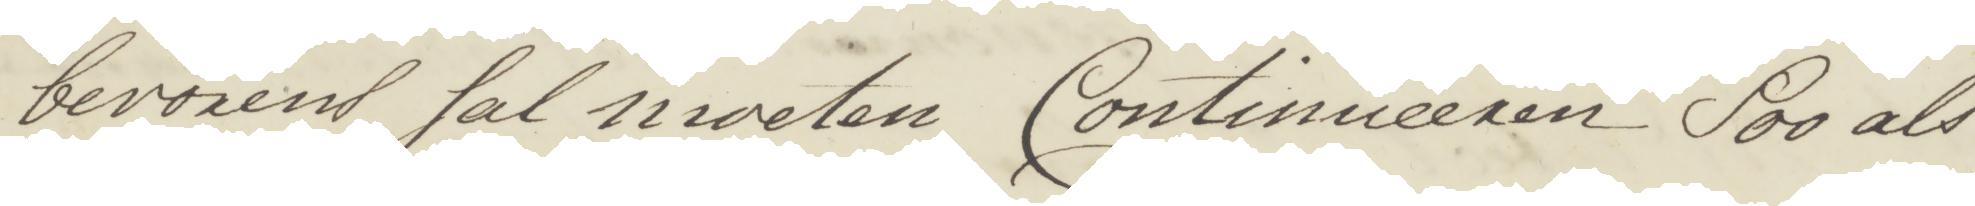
bevorens sal moeten Continueeren soo als
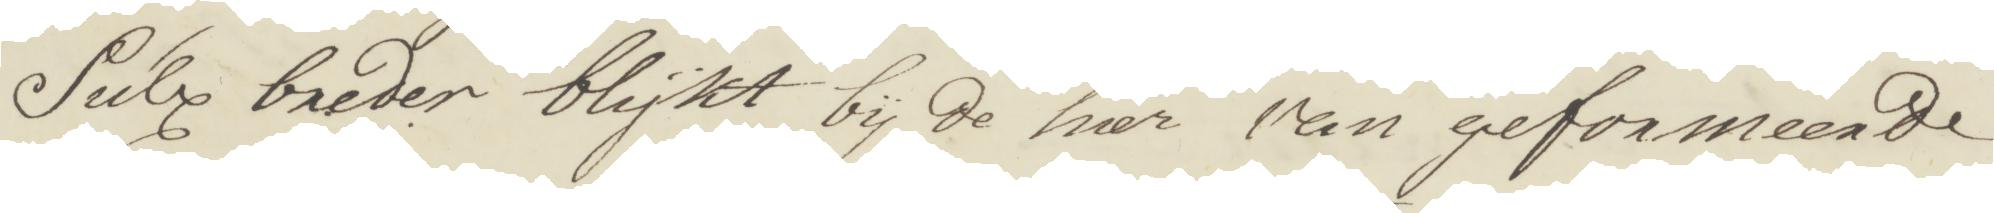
sulx breder blijkt bij de hier van geformeerde
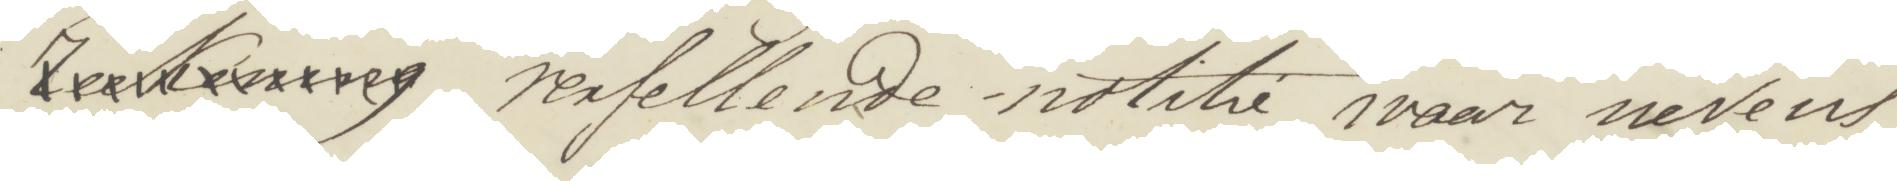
reekening versellende notitie waar nevens
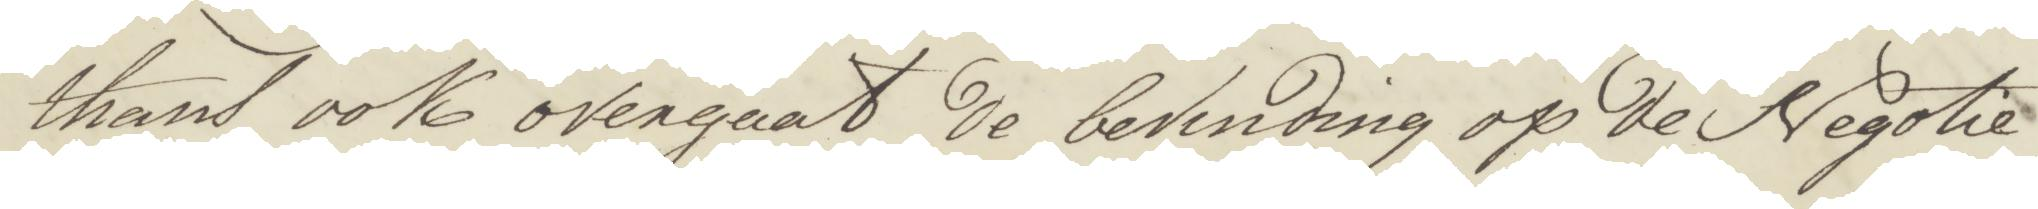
thans ook overgaat de bevinding op de Negotie
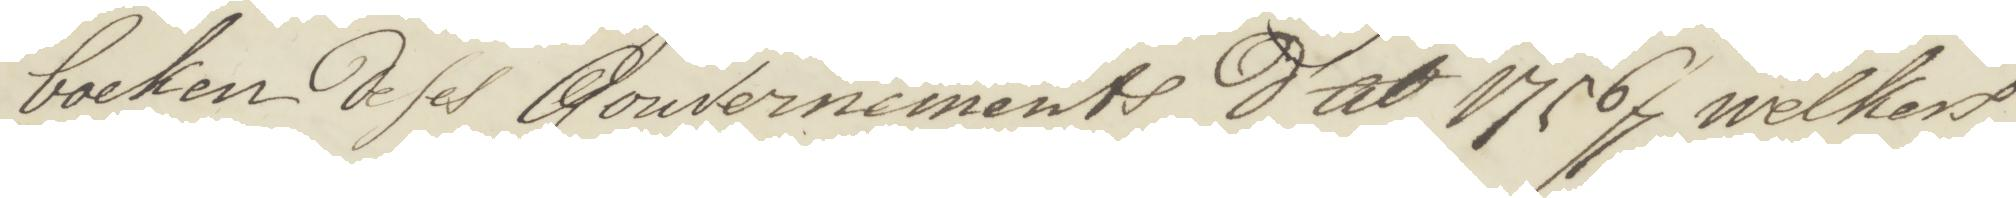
boeken deses Gouvernements d’ao 1756/7 welkers
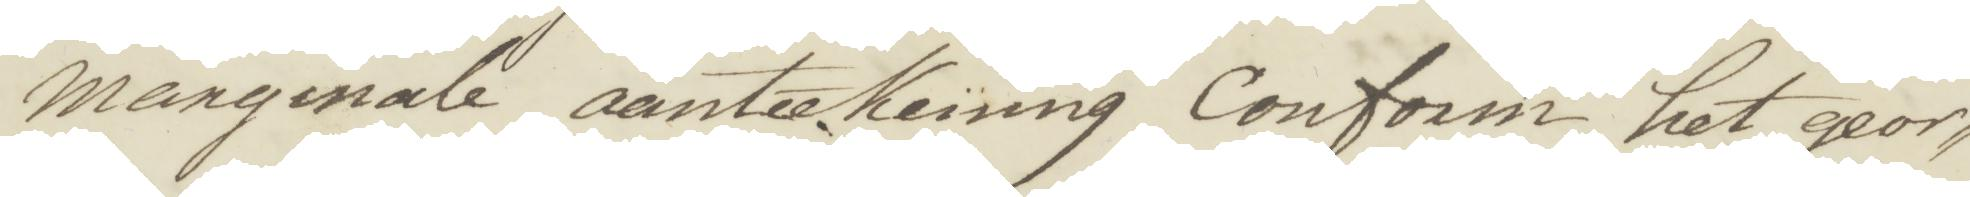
marginale aanteekening conform het geor„
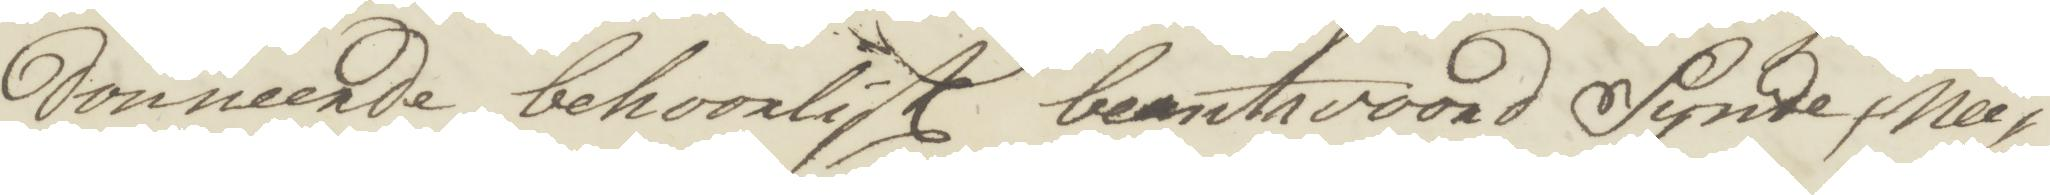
donneerde behoorlijk beantwoord synde, nee
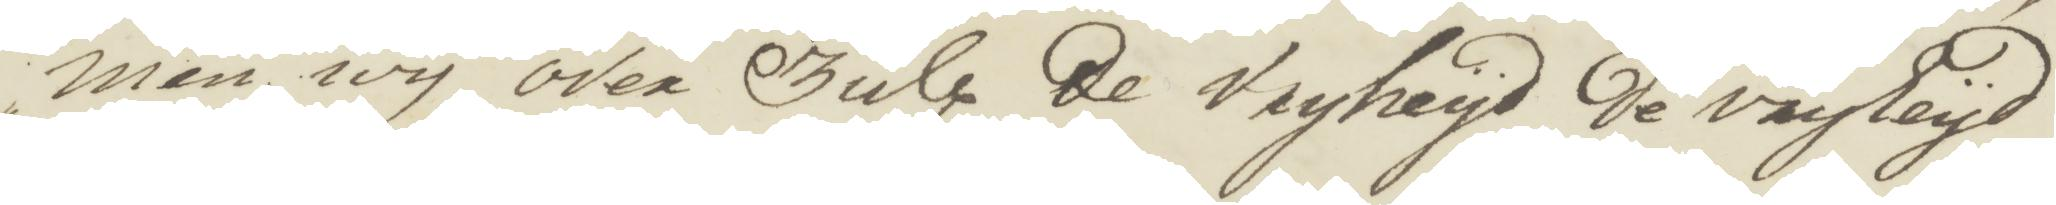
„men wij over zulx de vryheijd de vrijheijd
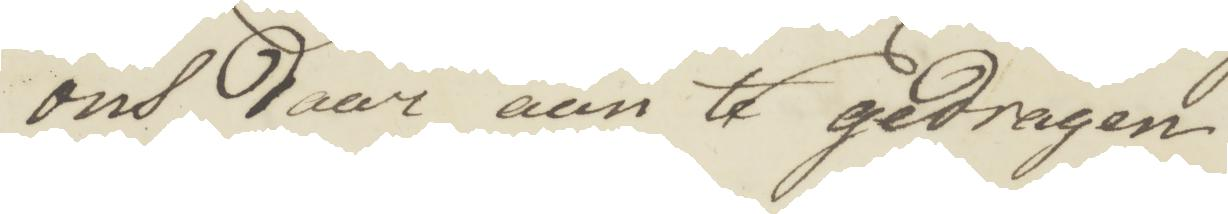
ons daar aan te gedragen.
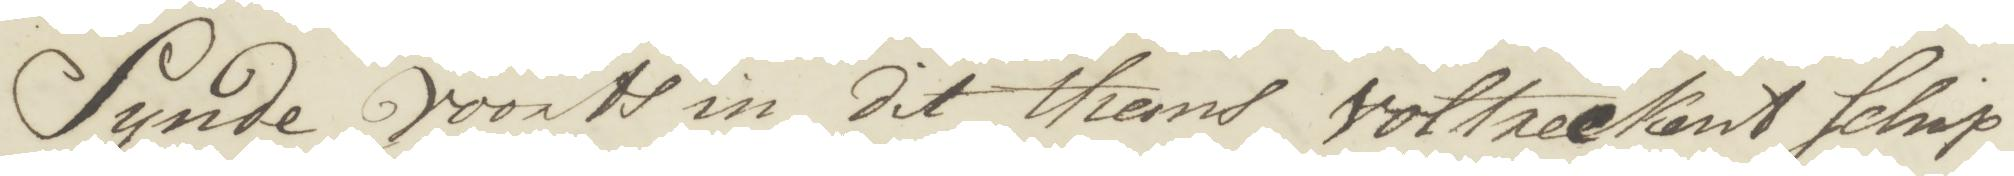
Synde voorts in dit thans voltreckent schip
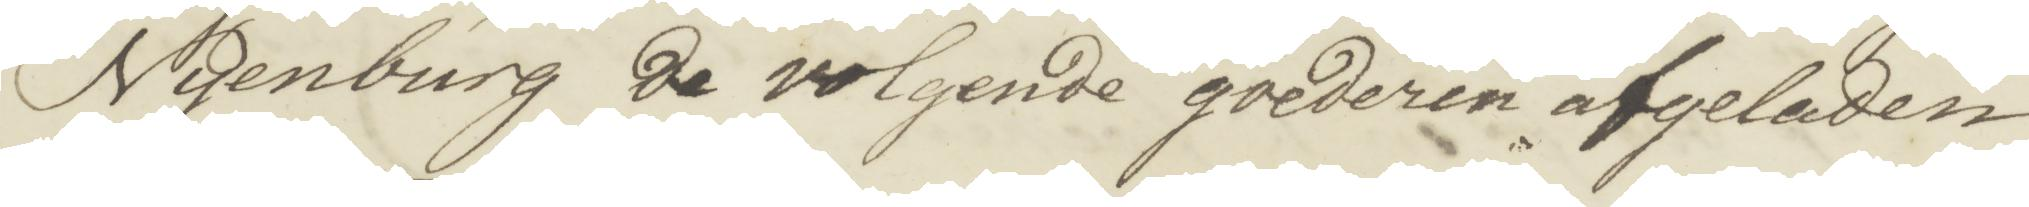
Nyenburg de volgende goederen afgeladen
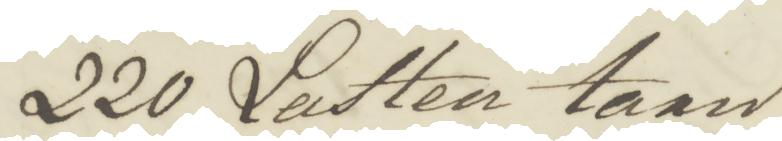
220 Lasten tarw
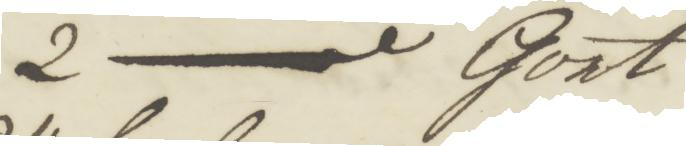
2 _o Gort
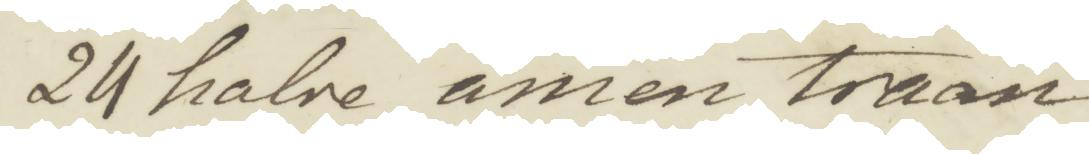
24 halve amen traan
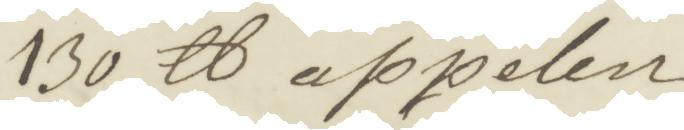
130 lb appelen
